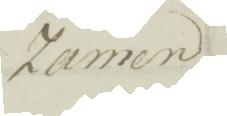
Zamen
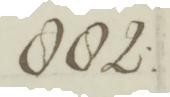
882:
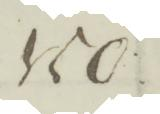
150:
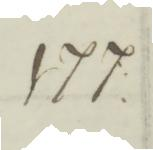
177:
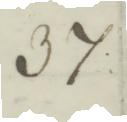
37:
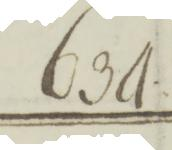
634.
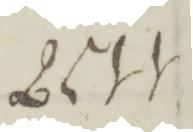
2511
